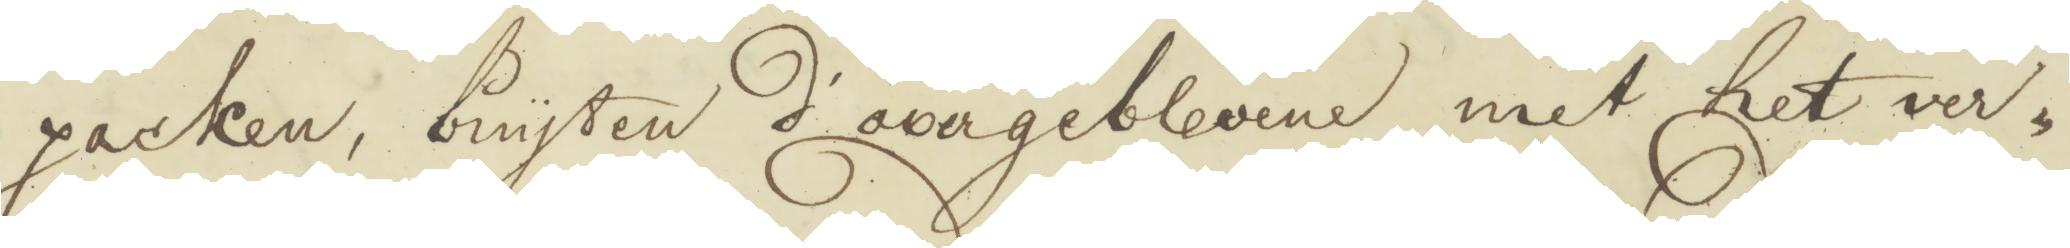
packen, buijten d’ over geblevene met het ver„
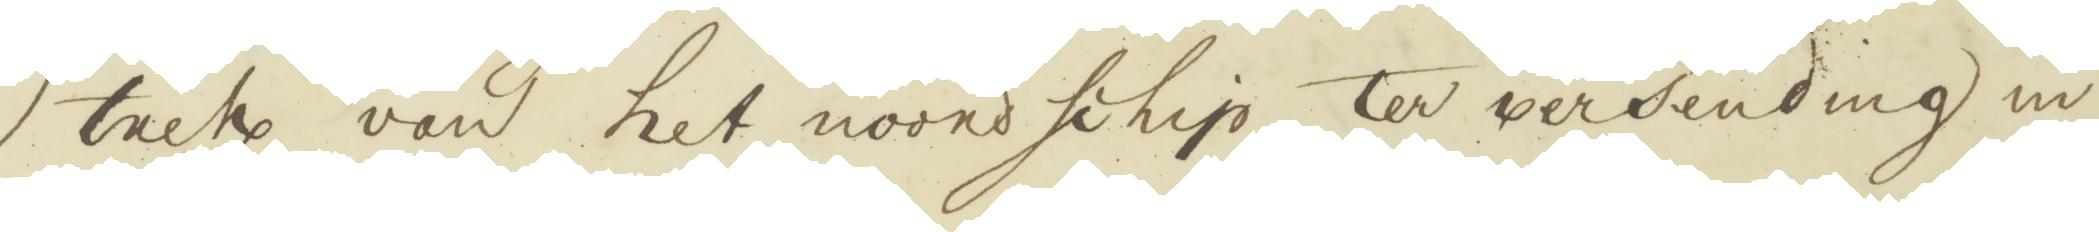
trek van het noord Schip, ter versending in
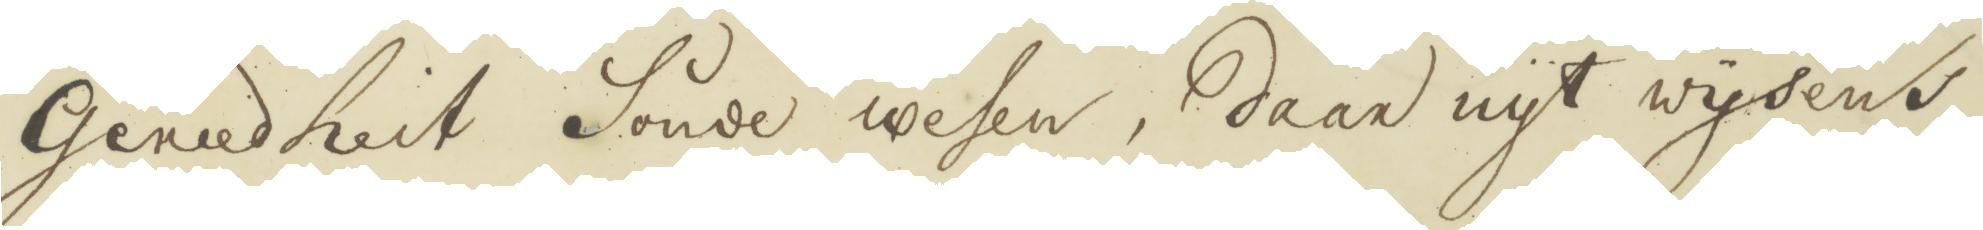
Gereedheit Soude wesen, daar uijt wijsens
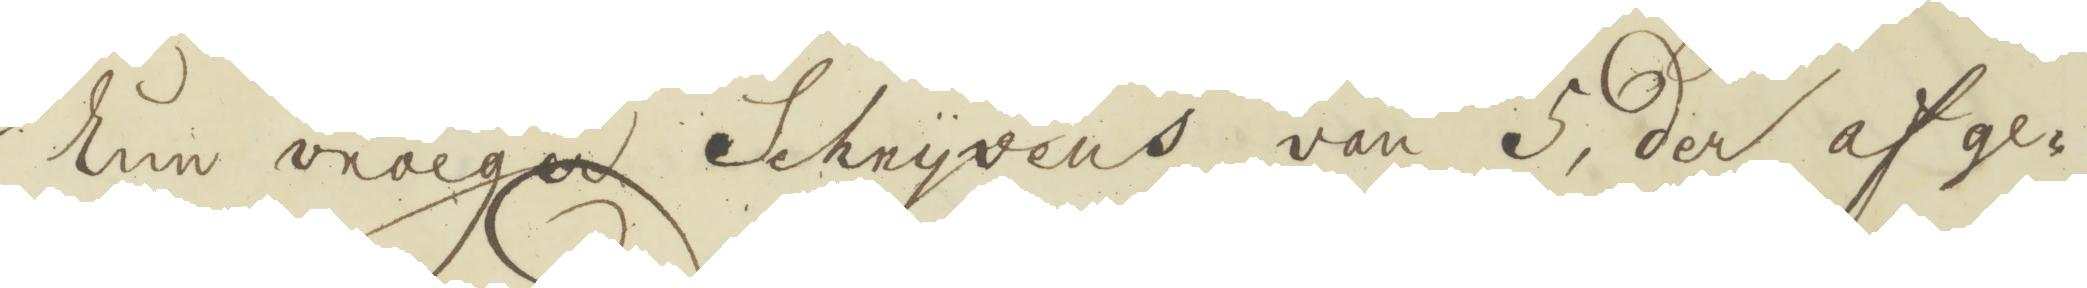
hun vroeger Schrijvens van 5, der afge„
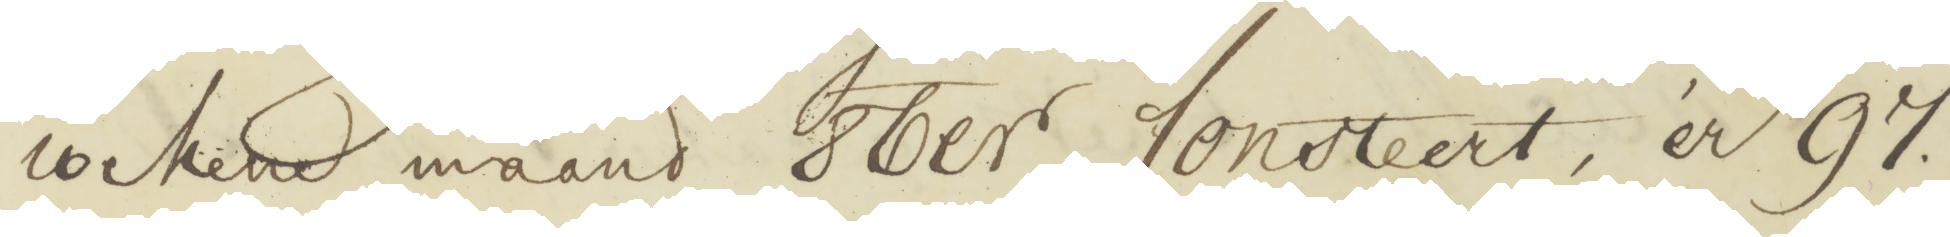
wekene maand 8ber Consteert, er 97.
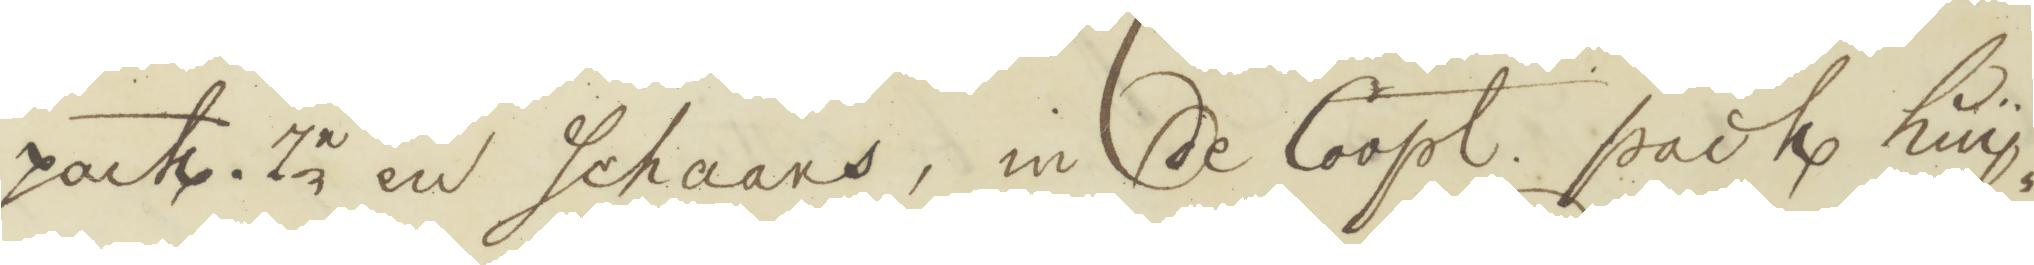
pack. 7„r en Schaars, in de Coopl. pack huij„
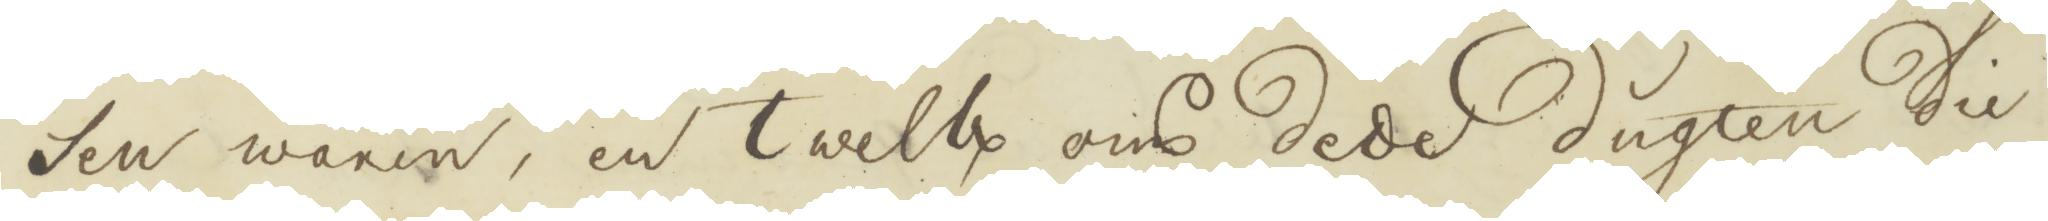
sen waren, en 't welk ons dede dugten die
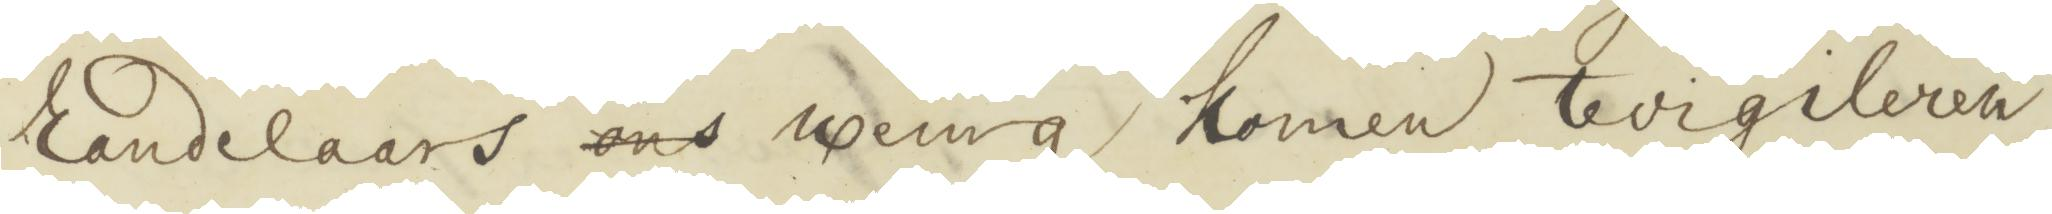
handelaars ons wenig komen te vigileren
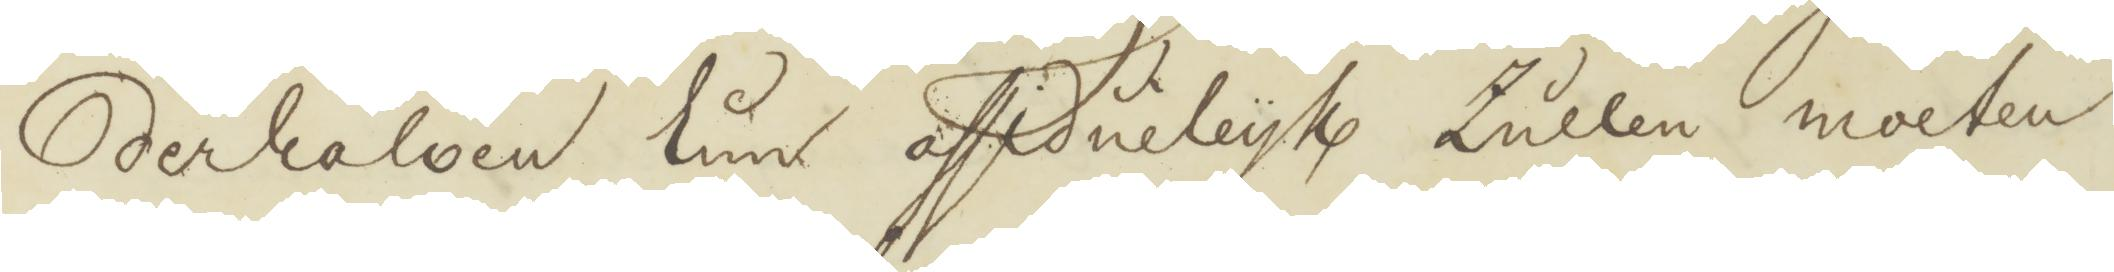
derhalven hun assidueleijk zullen moeten
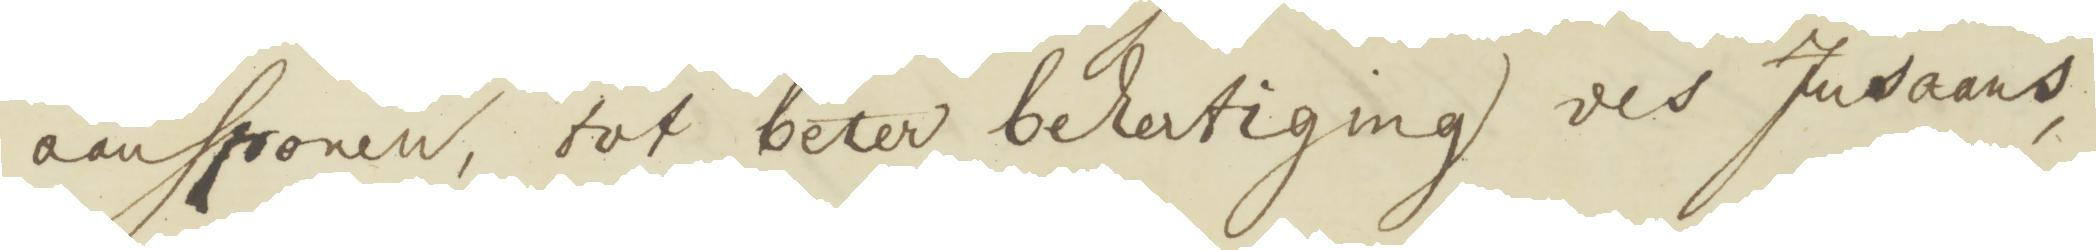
aansporen, tot beter behartiging des Jnsaars„
